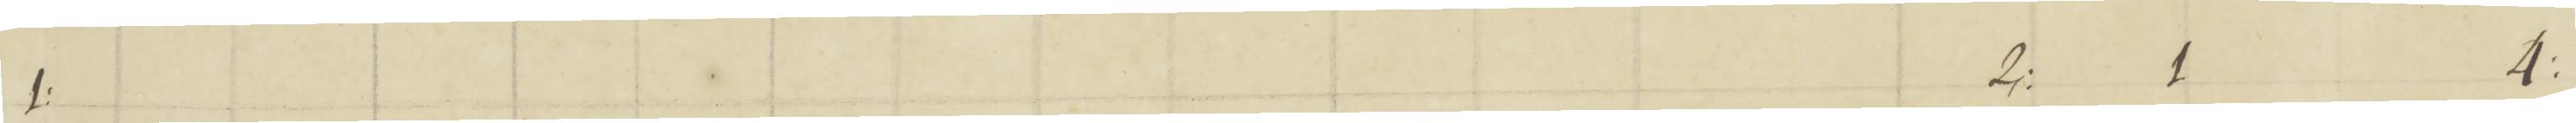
1: 2: 1 4:
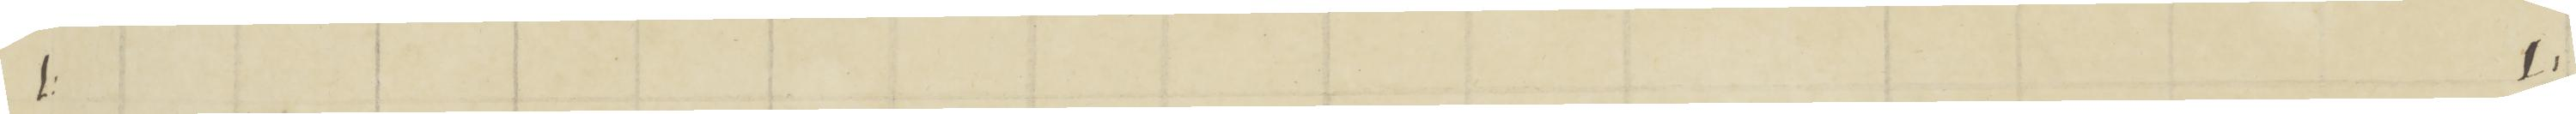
1: 1:
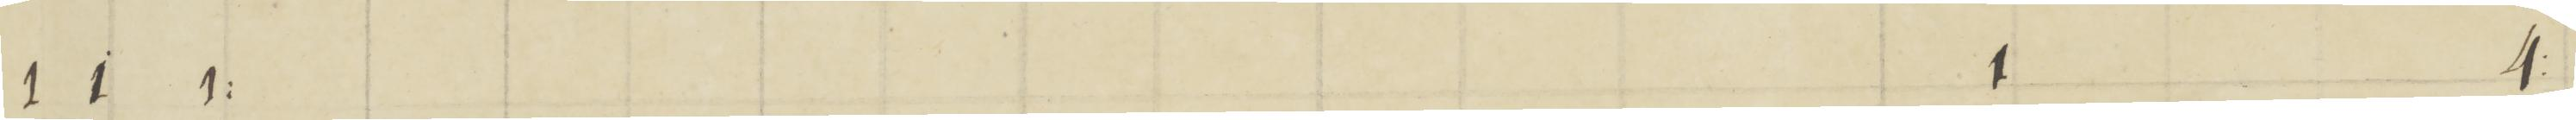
1 1 1: 1 4:
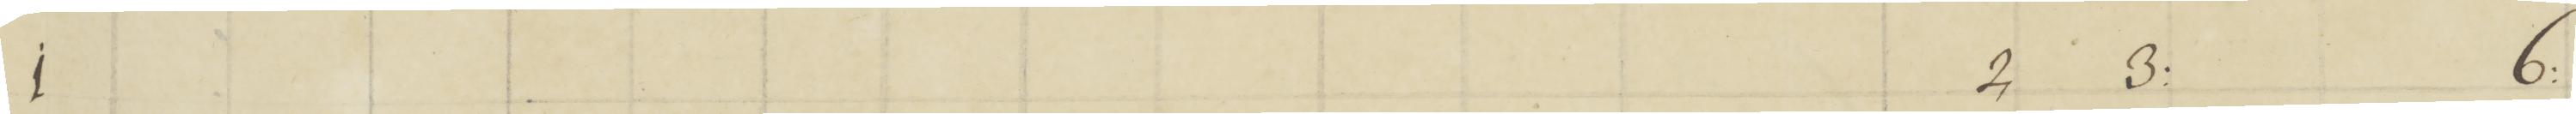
1 2 3: 6:
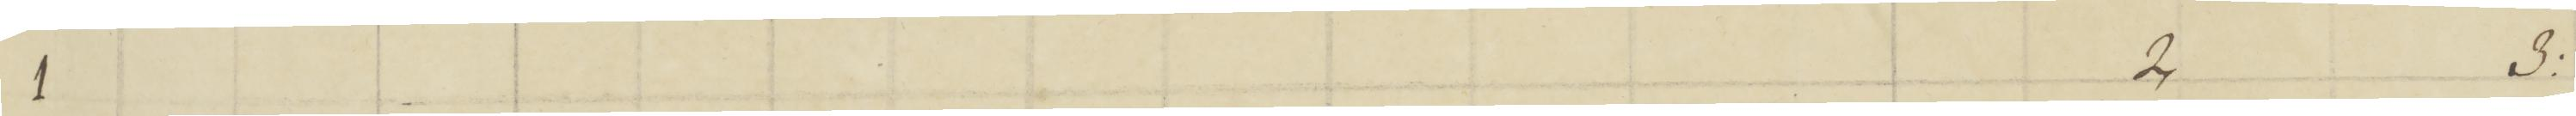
1 2 3:
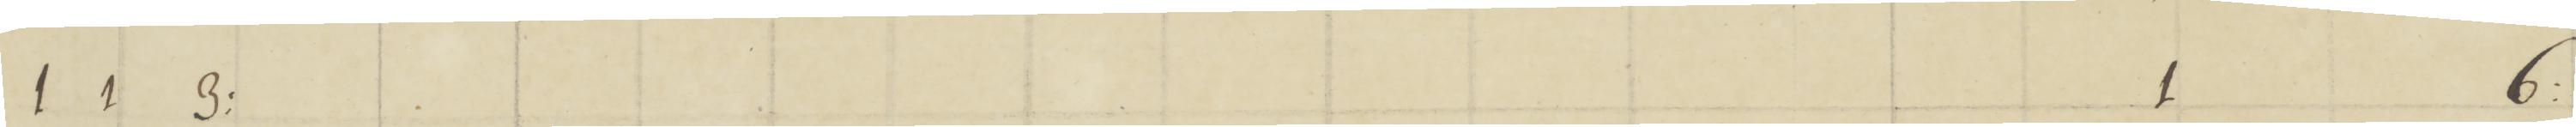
1 1 3: 1 6:
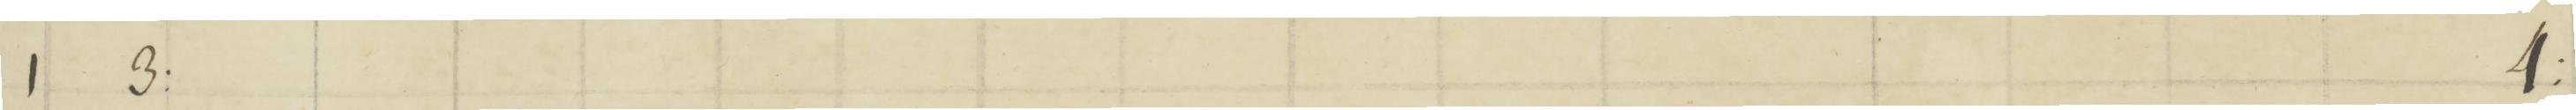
1 3: 4:
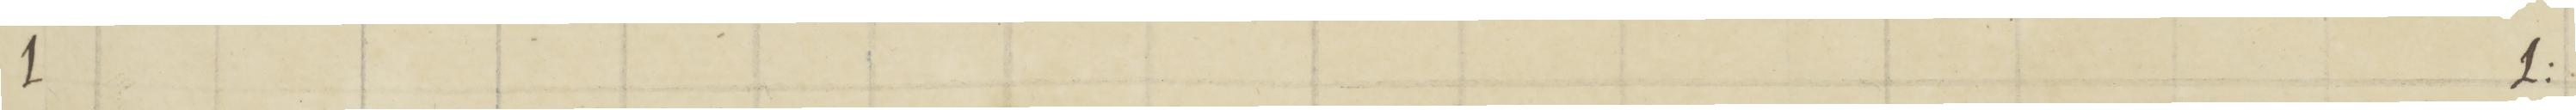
1 1:
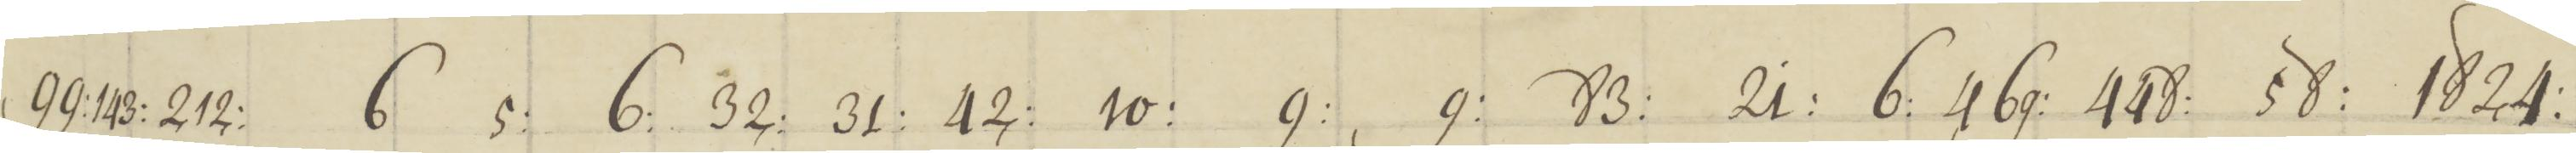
99: 143: 212: 6 5: 6: 32: 31: 42: 10: 9: 9: 83: 21: 6: 469: 448: 58: 1824:
